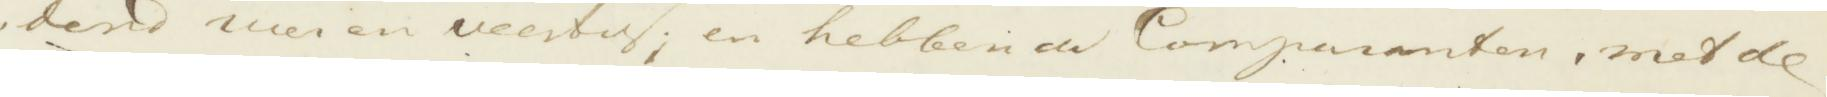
derd vier en veertig; en hebben de Comparanten, met de
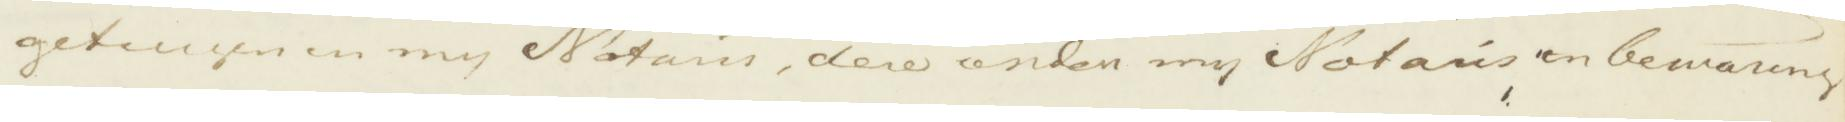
getuigen in my Notaris, deze onder my Notaris, in bewaring
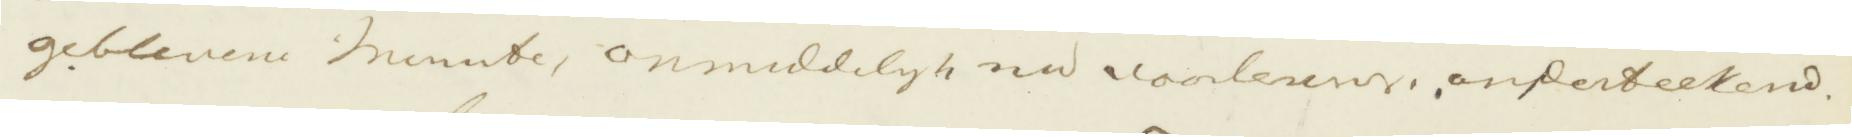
geblevene Minute, onmiddelyk na voorlezing, onderteekend.
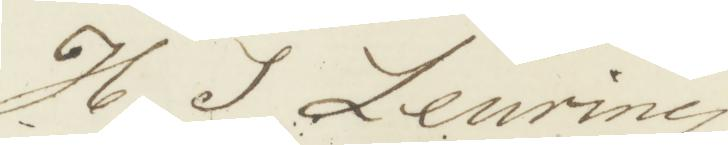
H I Leuring
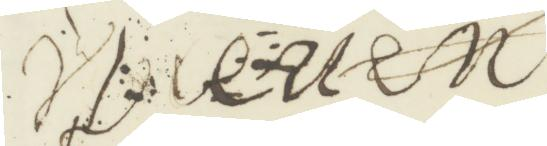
V Diemen
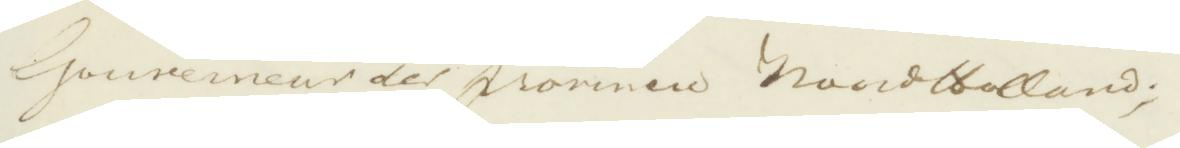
Gouverneur der provincie Noord Holland;
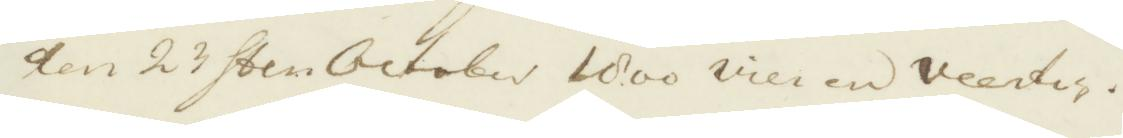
den 23 sten October 1800 vier en Veertig
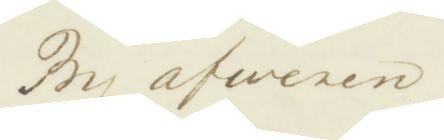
Bij afwezen
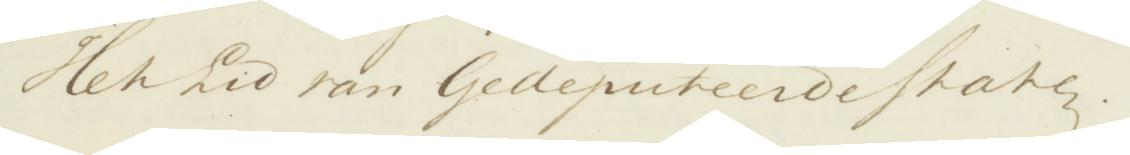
HetLid van Gedeputeerde staten.
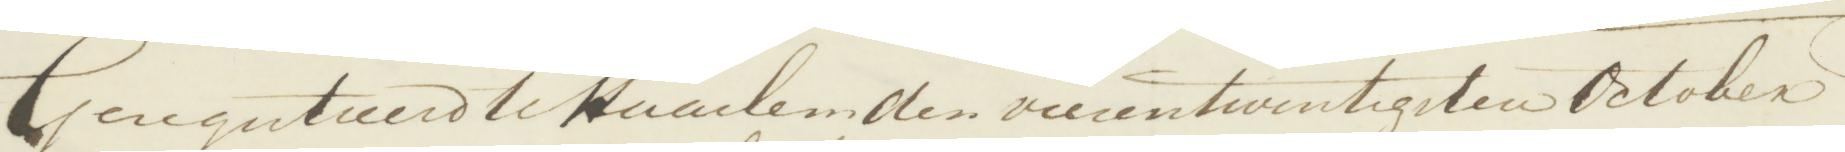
Geregistreerd teHaarlem den vierentwintigsten October
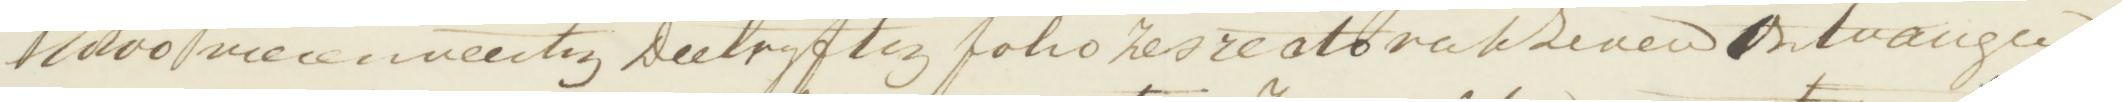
1800 vierenveertig Deelvyftig folio zes recto vak zeven Ontvangen
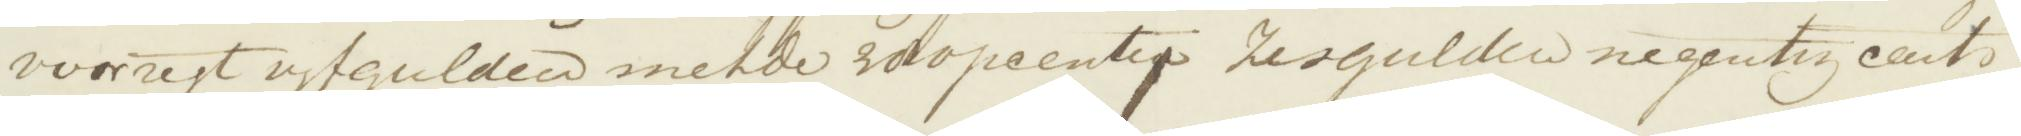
voor regt vyfgulden metde 38opcenten Zesgulden negentig cents
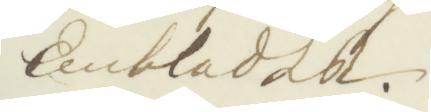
EenbladZR.
